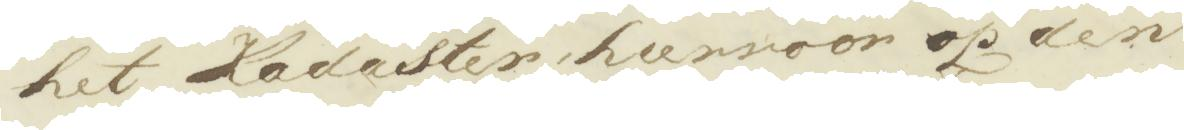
het Kadaster, hiervoor op den
